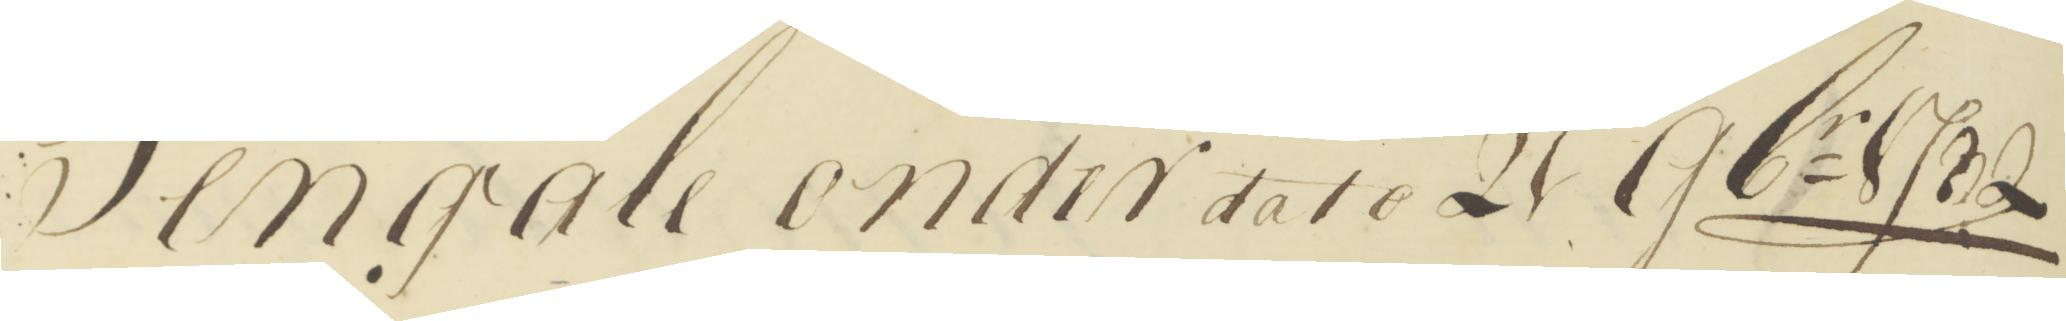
Van Bengale onder dato 21 gb=r 1732
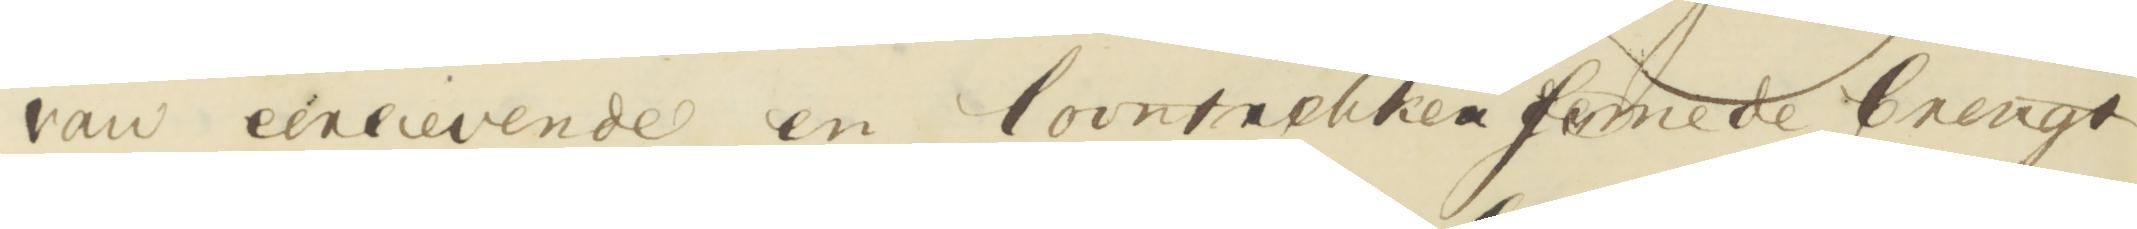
van eerlievende en loontrekker fu mede brengt
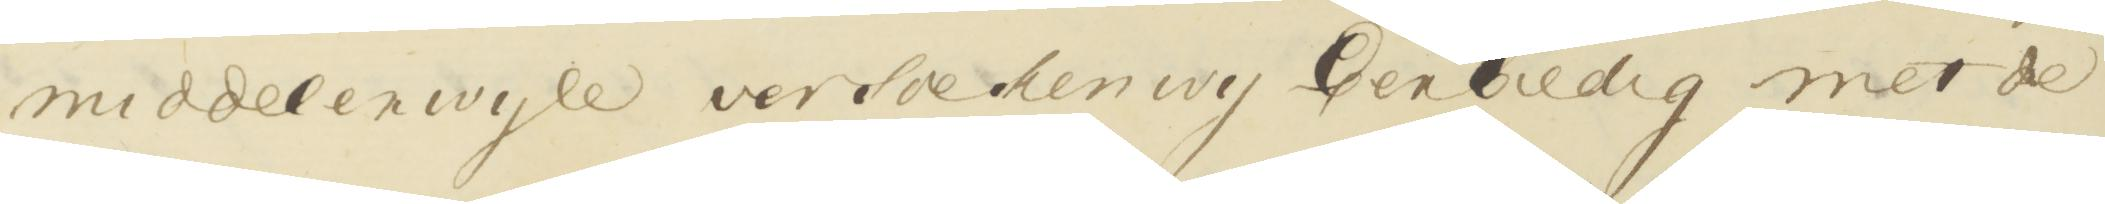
middelerwyle versoeken wy Eerbiedig met de
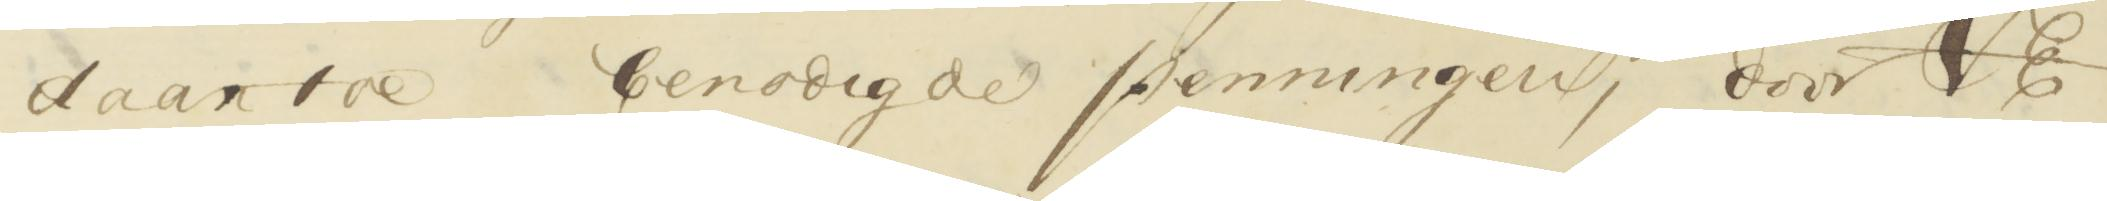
daartoe benodigde penningen; door VE
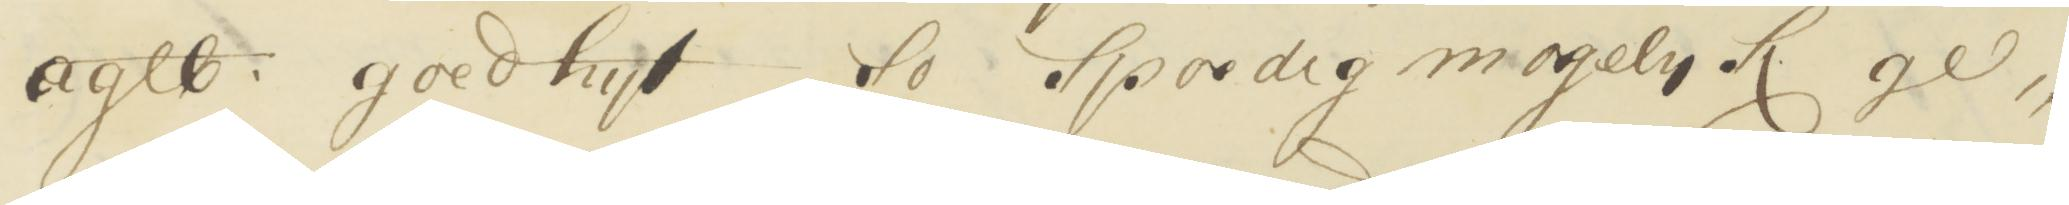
agtb: goedhyt so spoedig mogelyk ge„
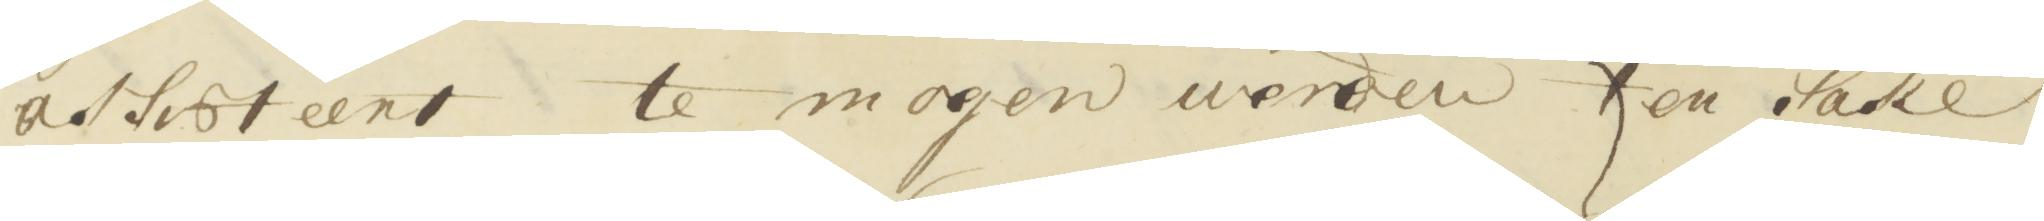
assisteert te mogen werden ter Sake
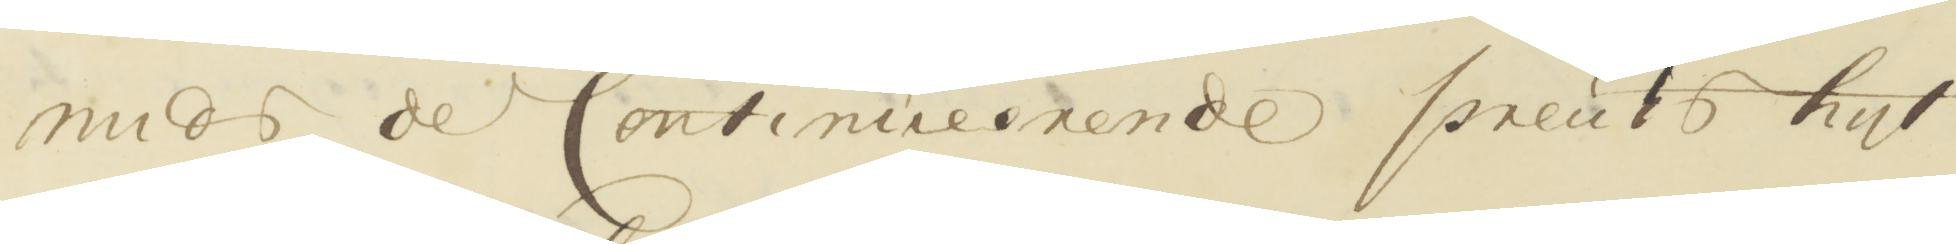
mids de Continueerende preutshyt
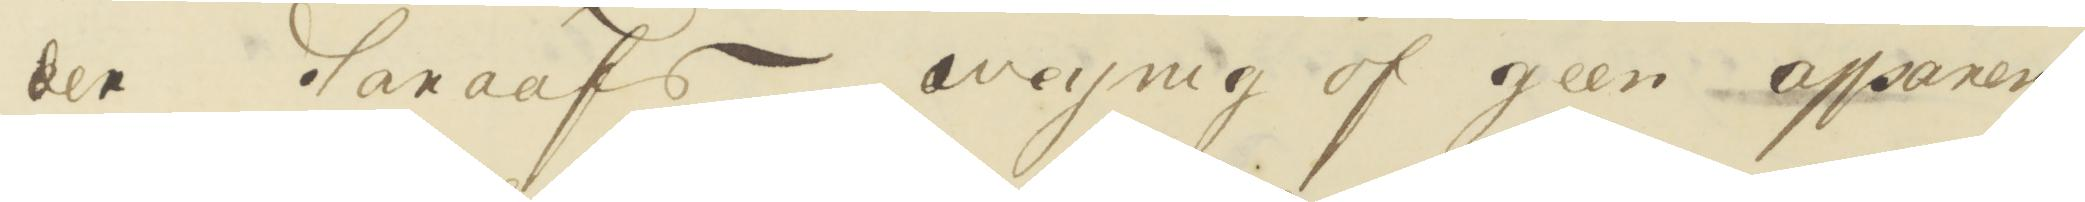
der Saraafs weynig of geen apparen„
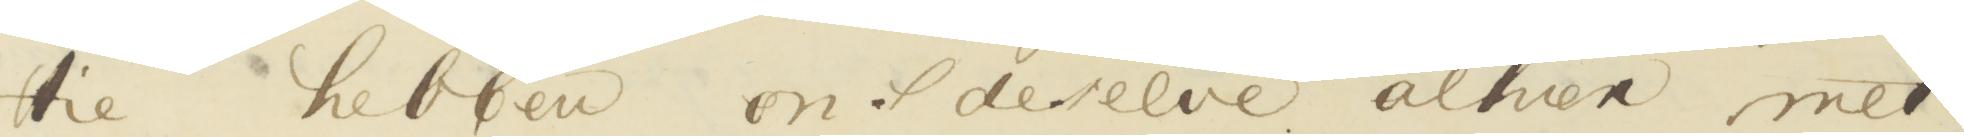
tie hebben ons deselve alhier met
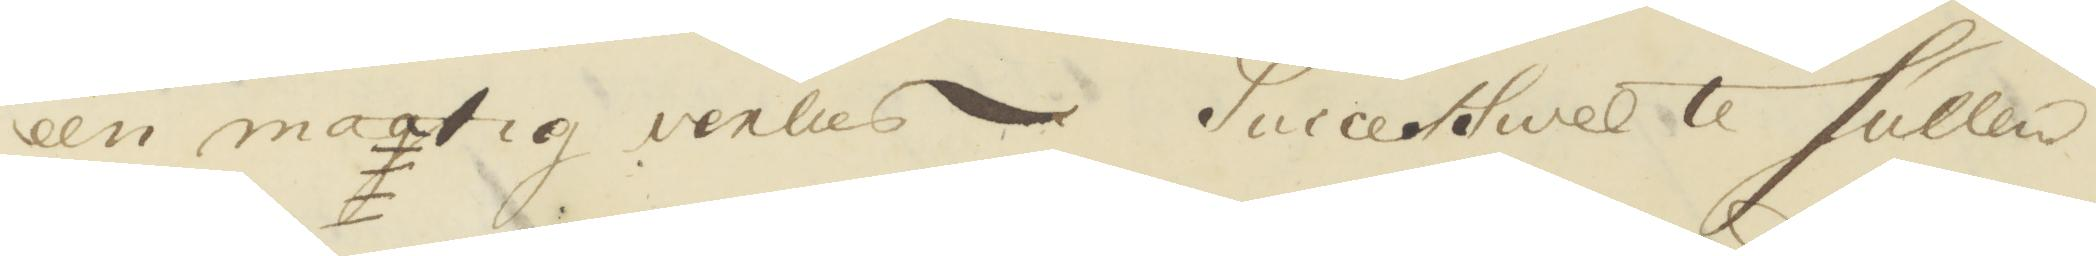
een magtig verlies Success wel te Sullen
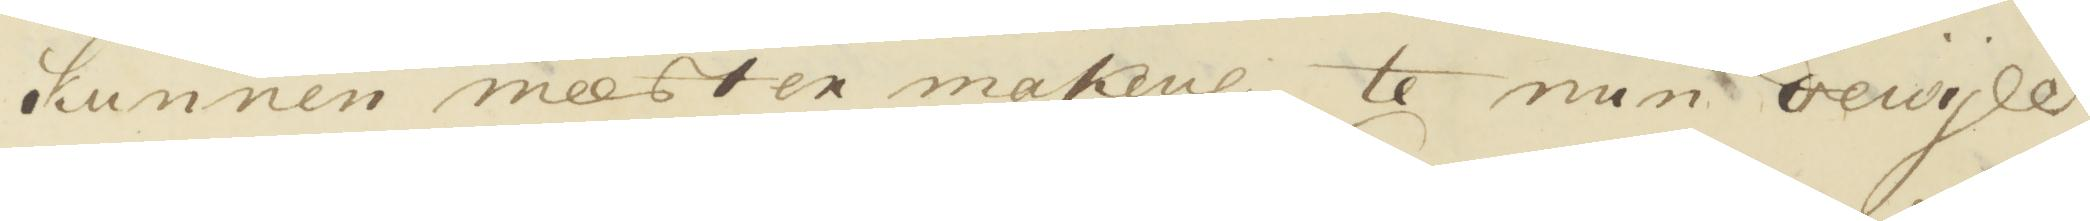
kunnen meester maken; te min dewijle
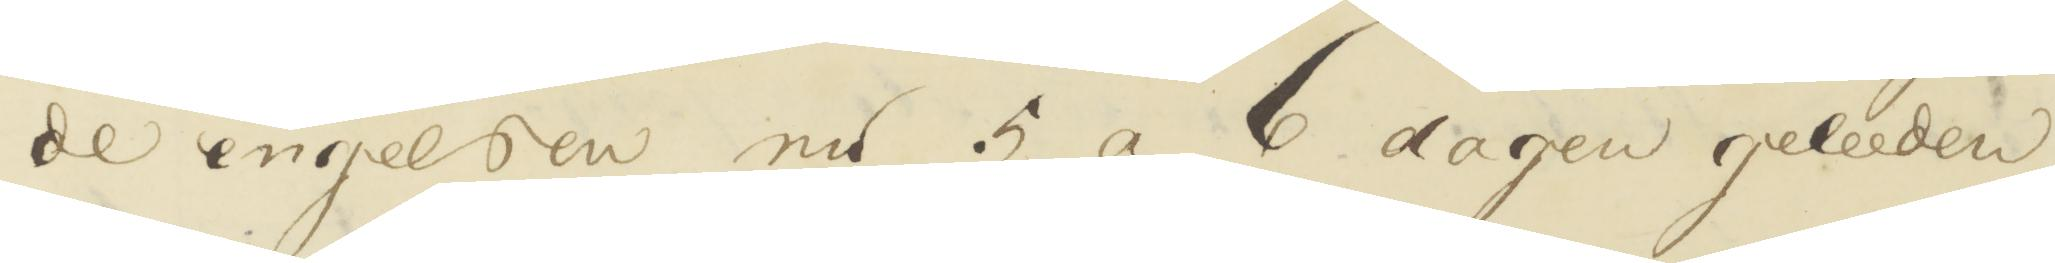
de engelsen nu 5 a 6 dagen geleeden
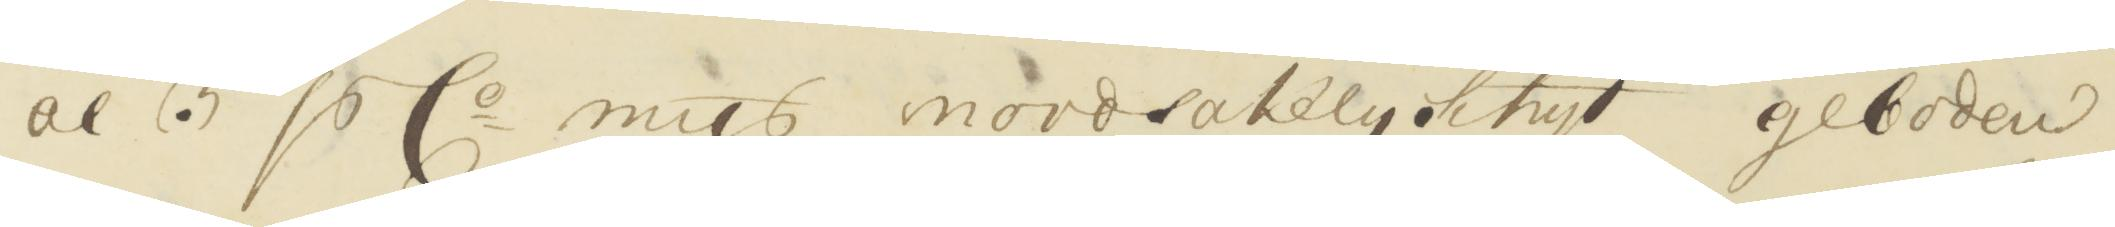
al 3 p C=o mits noodsakelykhyt geboden
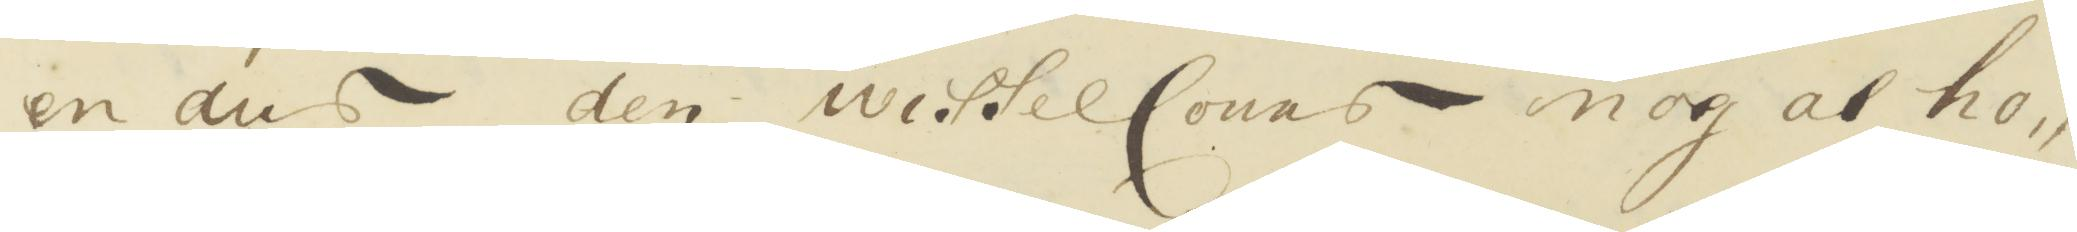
en dus den wissel Cours nog al ho„
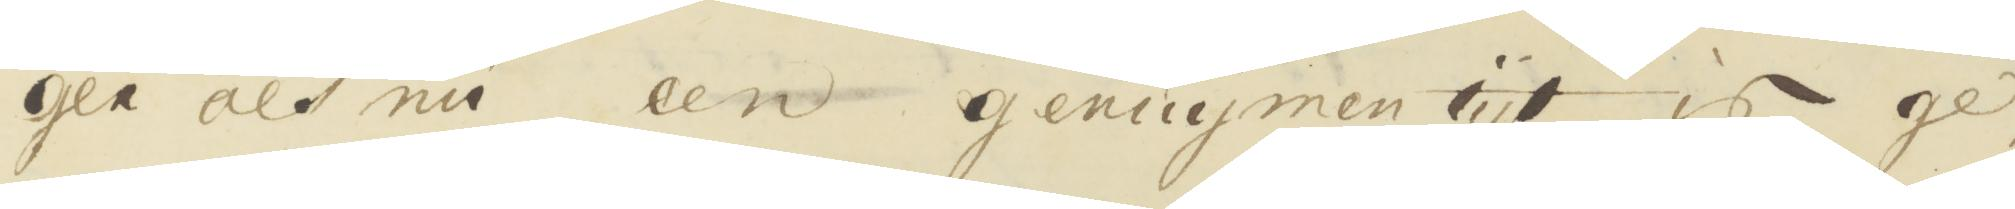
ger als nu een geruijmen tijt is ge
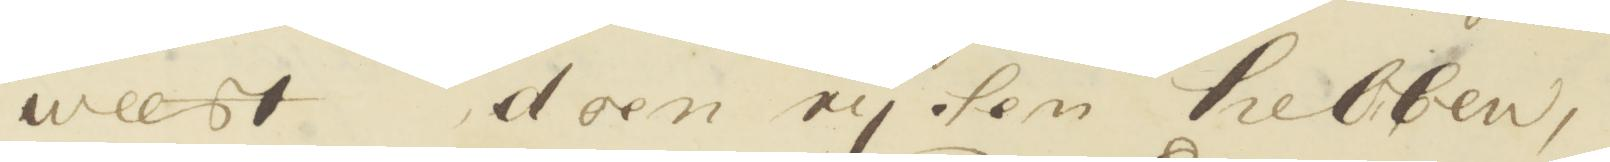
weest doen rysen hebben,
